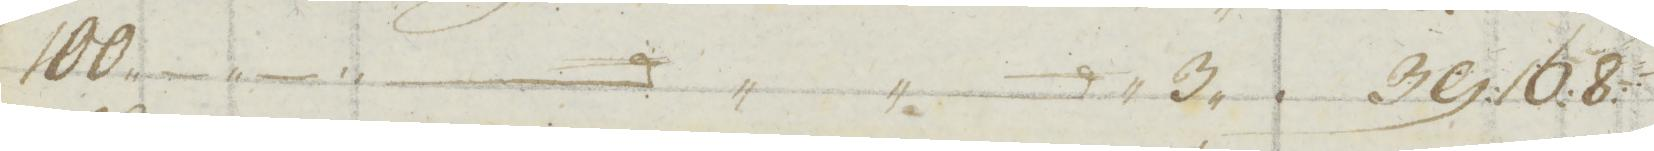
100„ —„ —„ _o „ „ _o „ 3„ . 39: 16: 8:
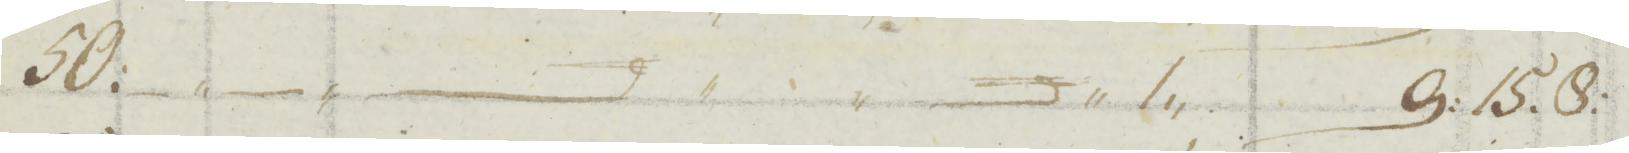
50: —„ —„ _o „ „ _o „ 4 „ 9: 15. 8:
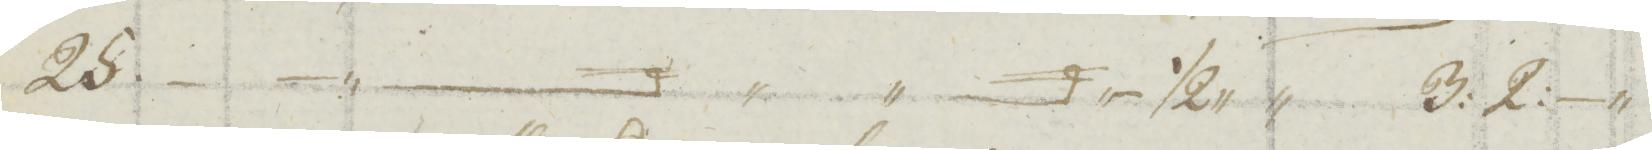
25: — —„ _o „ „ _o „ 1/2„ „ 3: 2: —„
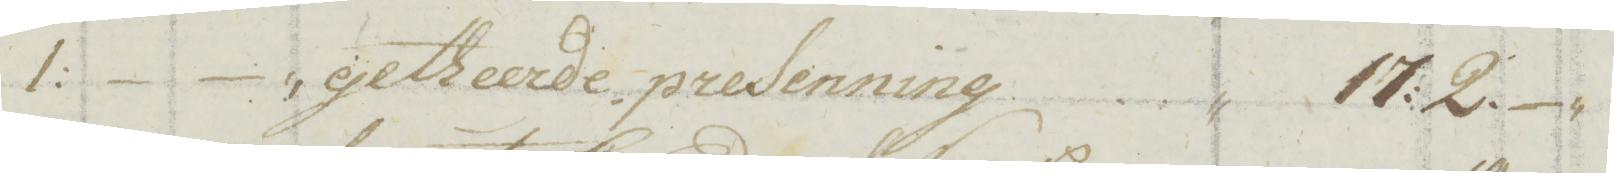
1: — —„ getheerde presenning . . . „ 17: 2: —„
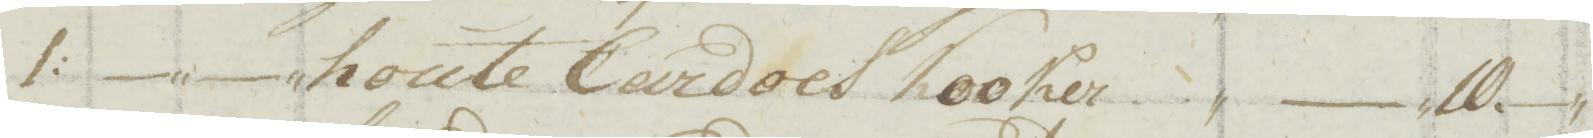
1: —„ —„ houte Cardoes kooker . . „ —„ 10: —„
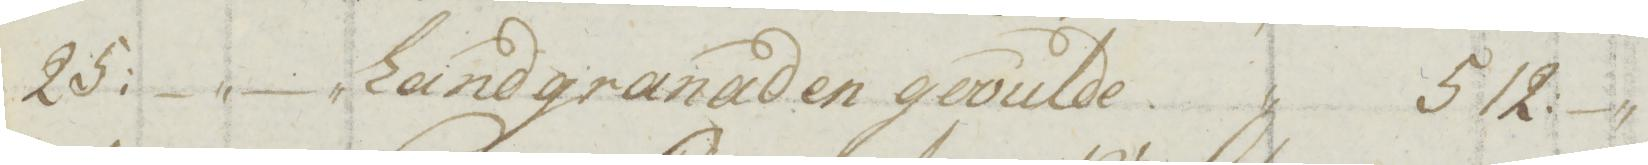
25: —„ —„ handgranaden gevulde . „ 5 12: —„
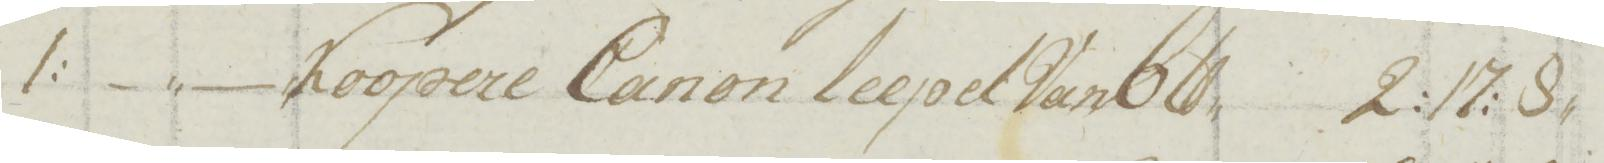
1: —„ —„ koopere Canon leepel Van 6 lb„ 2:17: 8„
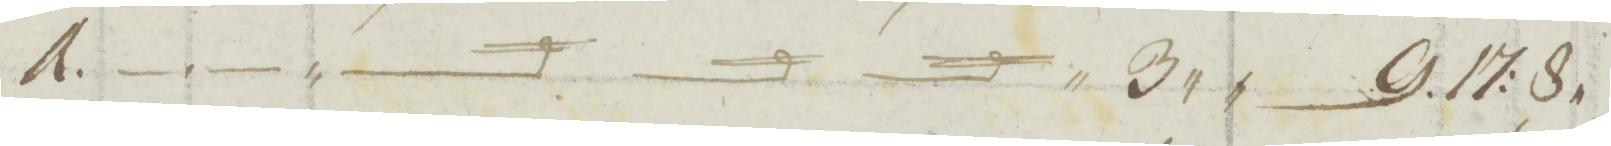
4. —„ —„ _o _o _o „ 3 „ „ 9.17: 8„
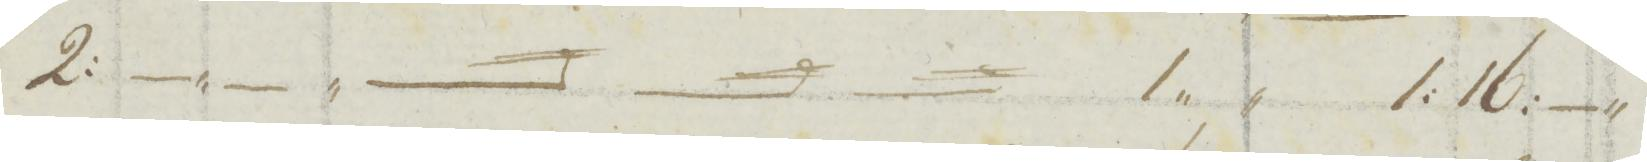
2: —„ —„ _o _o _o 1 „ „ 1: 16:—„
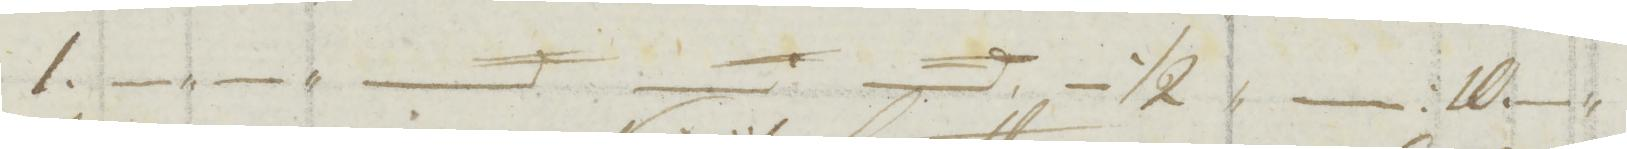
1. —„ —„ _o _o _o — 1/2 „ —: 10:—„
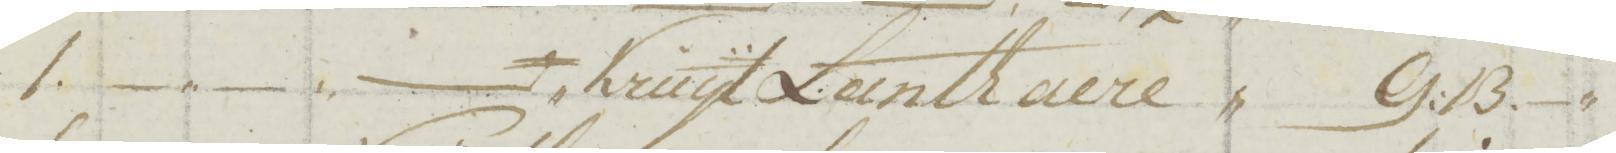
1. —„ —„ _„o kruijt Lanthaere „ 9:13.—„
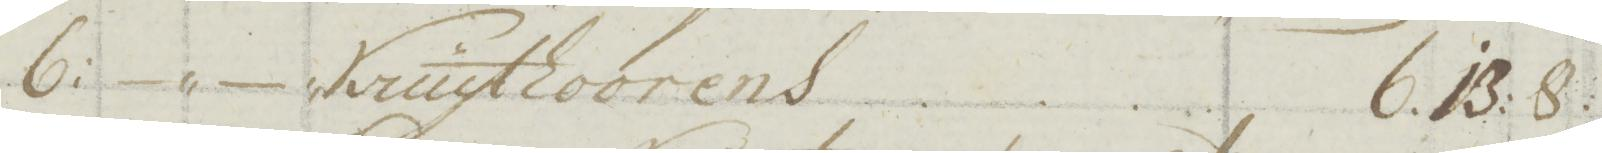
6: —„ —„ kruijthoorens 6. 13: 8:
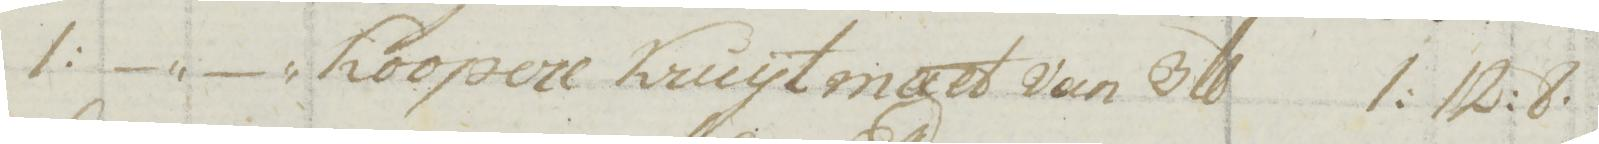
1: —„ —„ koopere kruijtmaet van 3 lb 1: 12: 8:
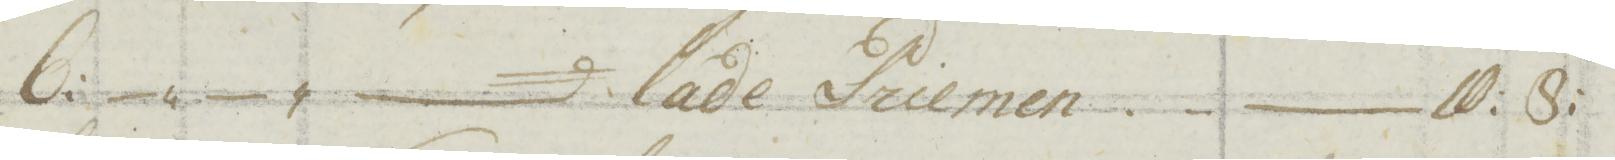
6: —„ —„ _o lade Priemen . . — 10: 8:
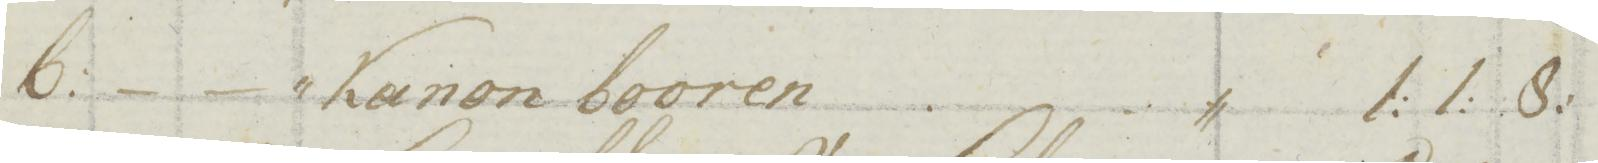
6: — —„ kanon booren . . . „ 1: 1: 8:
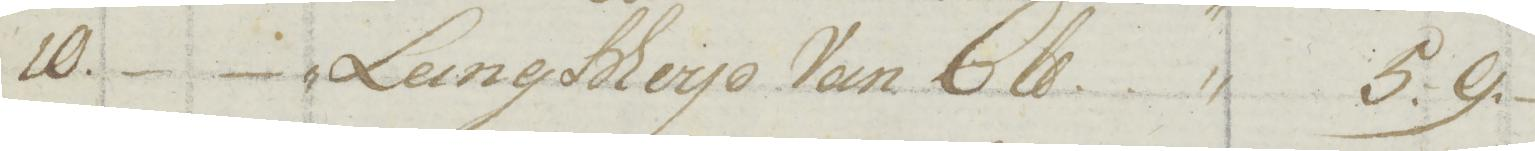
10. — —„ Langscherp Van 6 lb . . „ 5: 9.
